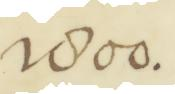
1800.
